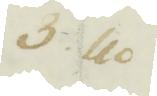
3:40
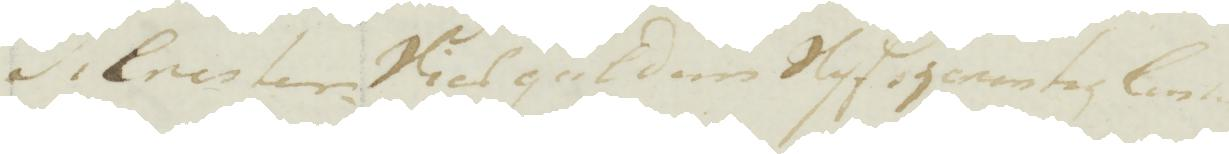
Silvester Vier guldens Vyf enzeventig Cents
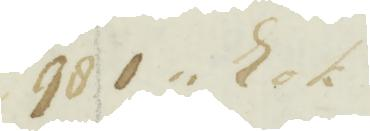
98. 1 „ rok
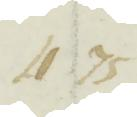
4.75
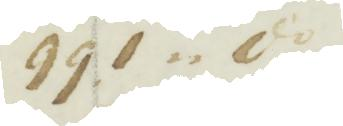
99. 1 „ do
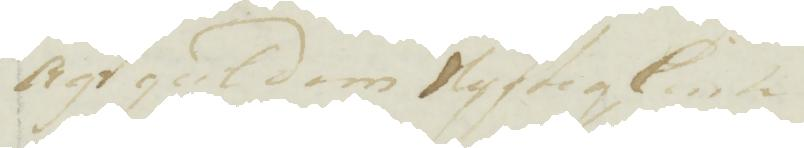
agt guldens Vijftig Cents
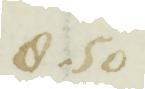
8.50.
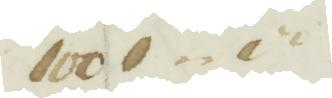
100. 1 „ do
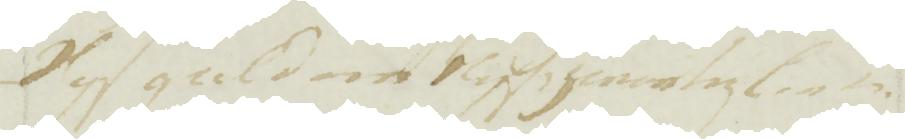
Vyf guldens Vijf zeventig Cents
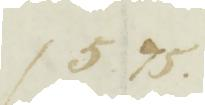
5.75.
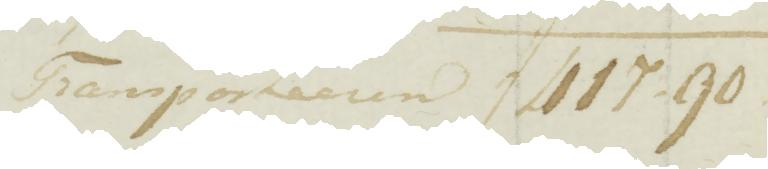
Transporteeren ƒ 417:90
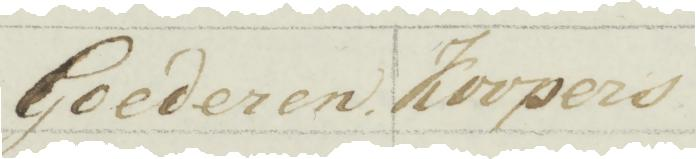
Goederen. Koopers
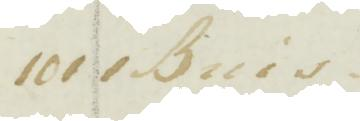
101 1 Buis
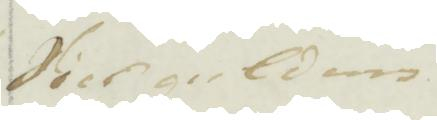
Vier guldens.
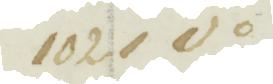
102„1 do
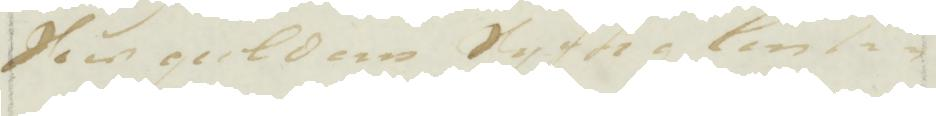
Vier guldens Vyftig Cents
